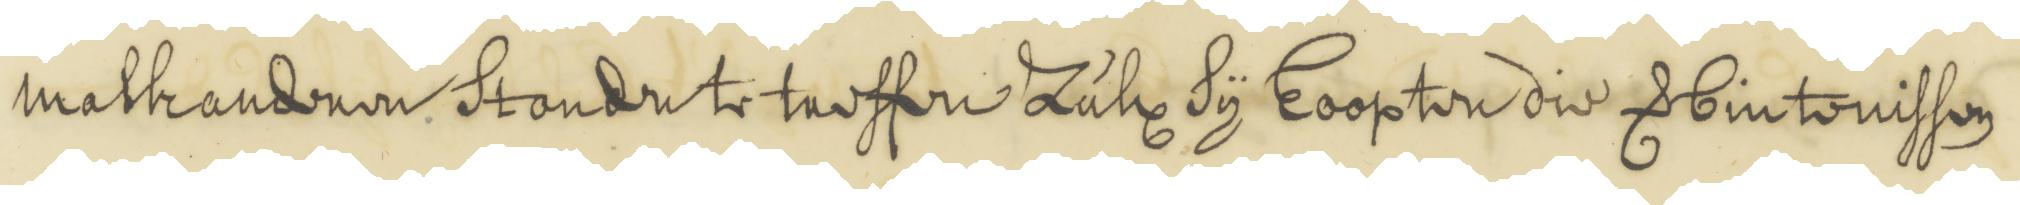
malkanderen stonden te treffen zulx sij hoopten die verbintenissen
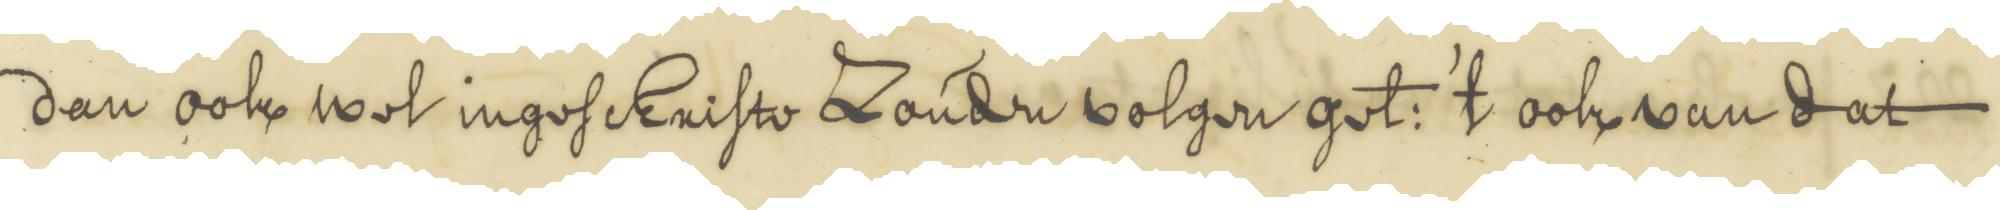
dan ook wel ingeschrifte zouden volgen get: 't ook van dat
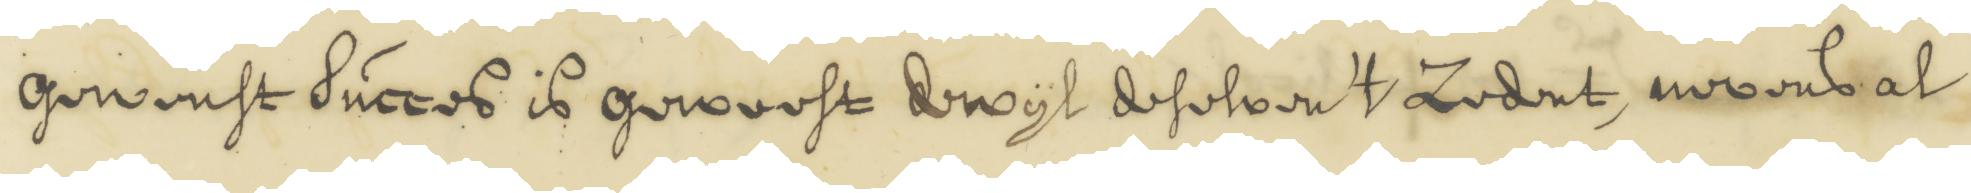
gewenst succes is geweest dewijl deselven ’t zedert, nevens al
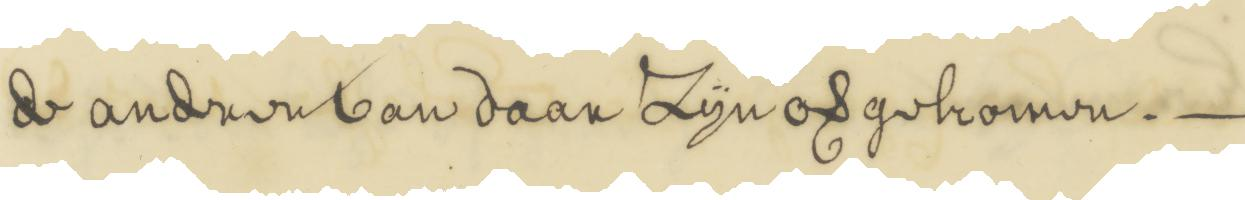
de anderen van daar zijn overgekomen. —
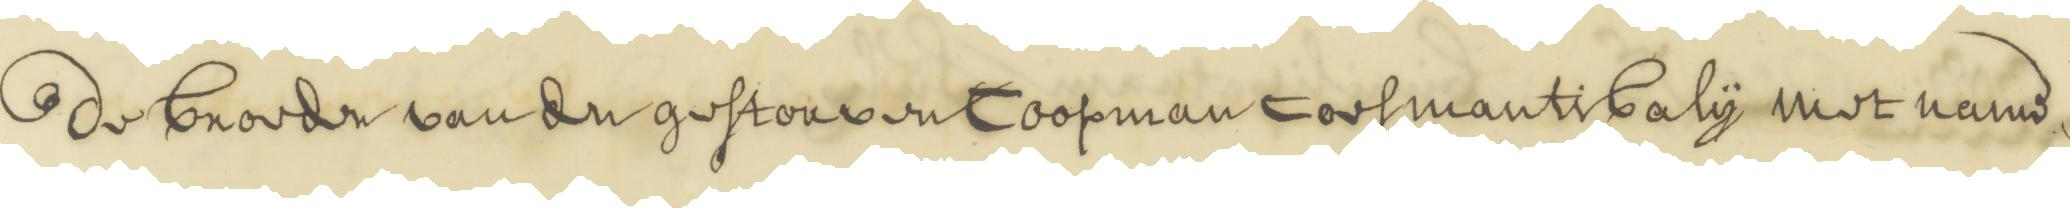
de broeder van den gestorven Coopman Coesmantibalij met name
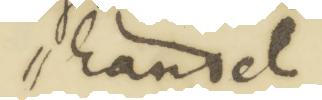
„handel
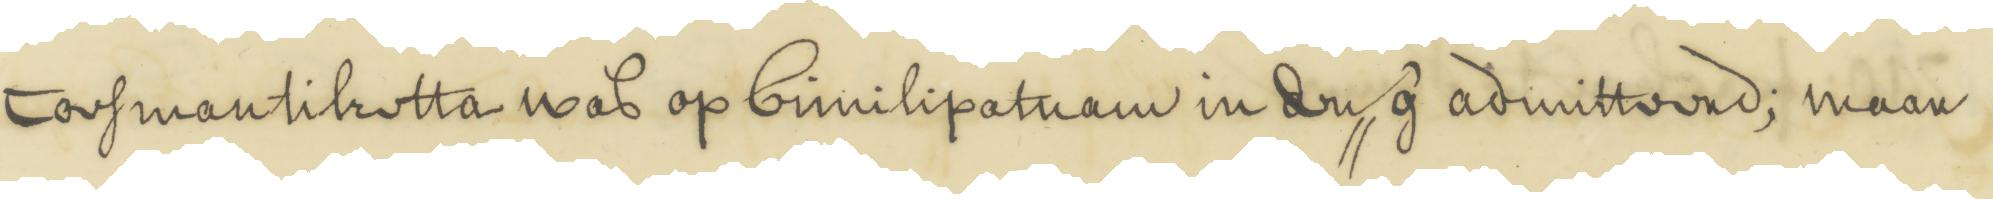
Coesmantiketta was op bimilipatnam in den„ g'admitteerd; maar
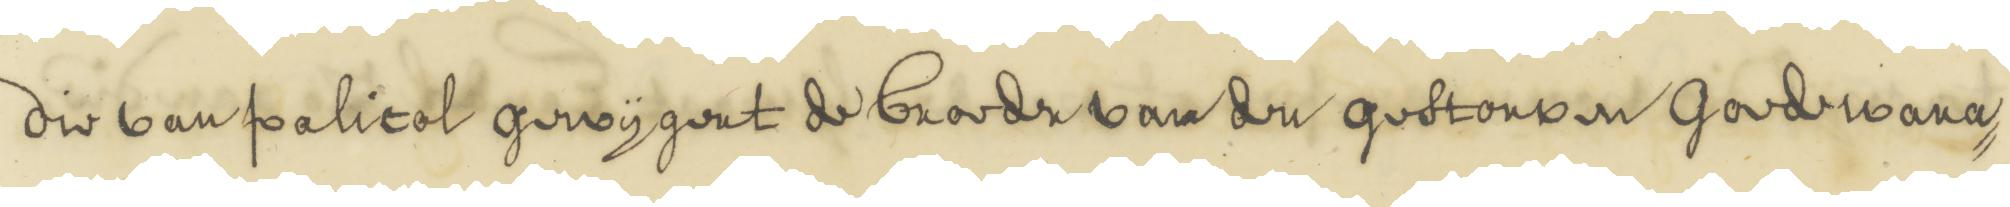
die van palicol gewijgert de broeder van den gestorven Goedewara„
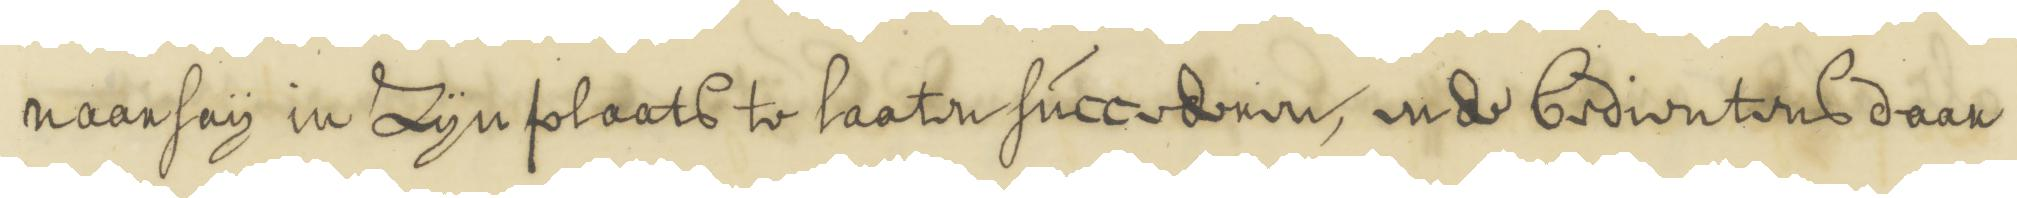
naarsaij in zijn plaats te laaten succederen, en de bedientens daar
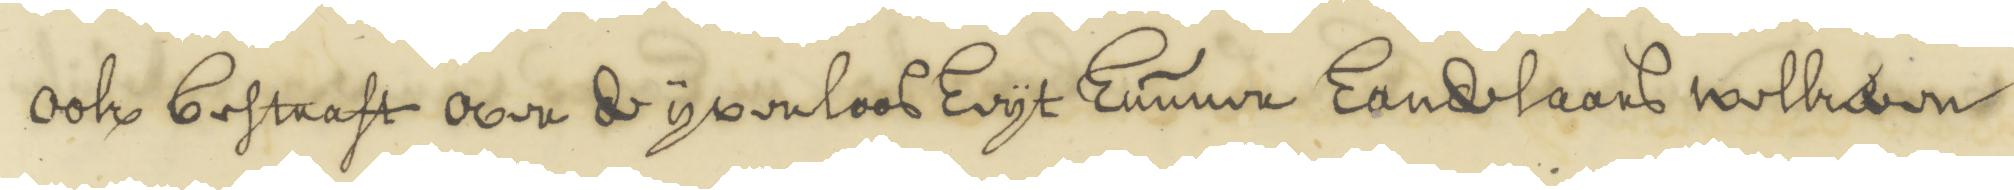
ook bestraft over de ijverloosheijt hunner handelaars welkeen
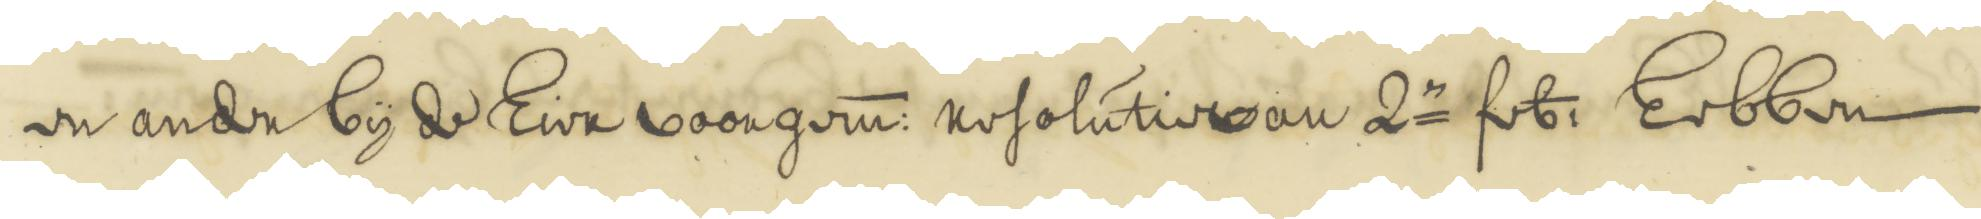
en ander bij de hier voor gem: resolutie van 2=en feb: hebben
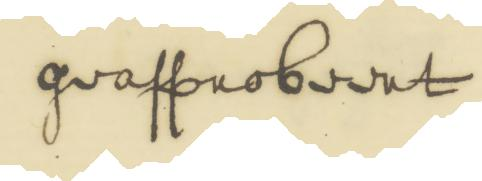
geapprobeert
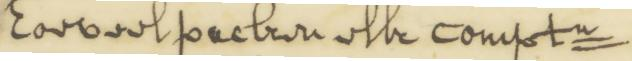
hoeveel packen elk compt=r
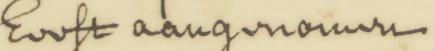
heeft aangenomen
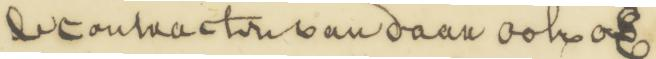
de contracten van daar ook over
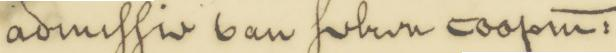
admissie van seker coopm:
